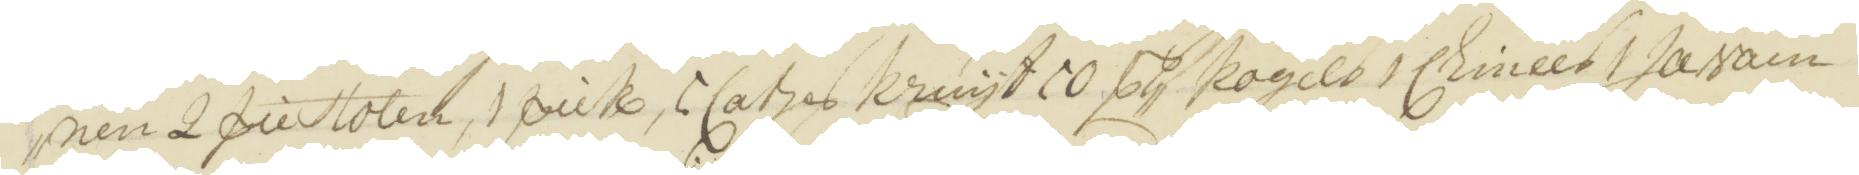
„nen 2 piestolen, 1 piek, 5 Catjes kruijt 50 p„s kogels 1 Chinees 1 Javaen
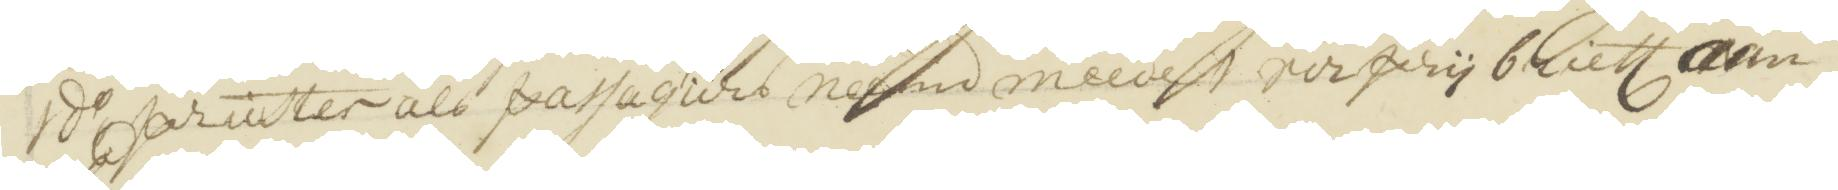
1 d„o priester als passagiers neemd meede 1 verprijbrieff aan
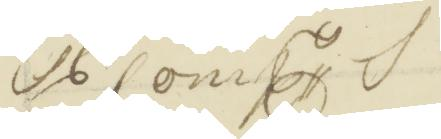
sE Comp„s
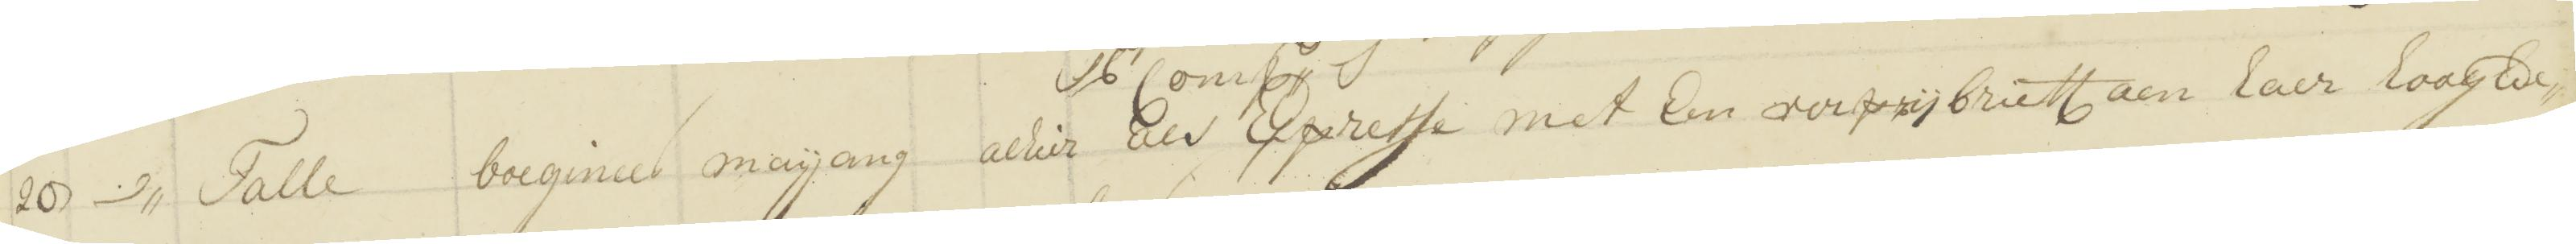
28 _„ Talle boeginees maijang alhier als Expresse met Een verprijbrieff aen haer hoog Ede„
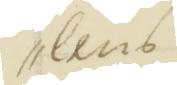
„lens
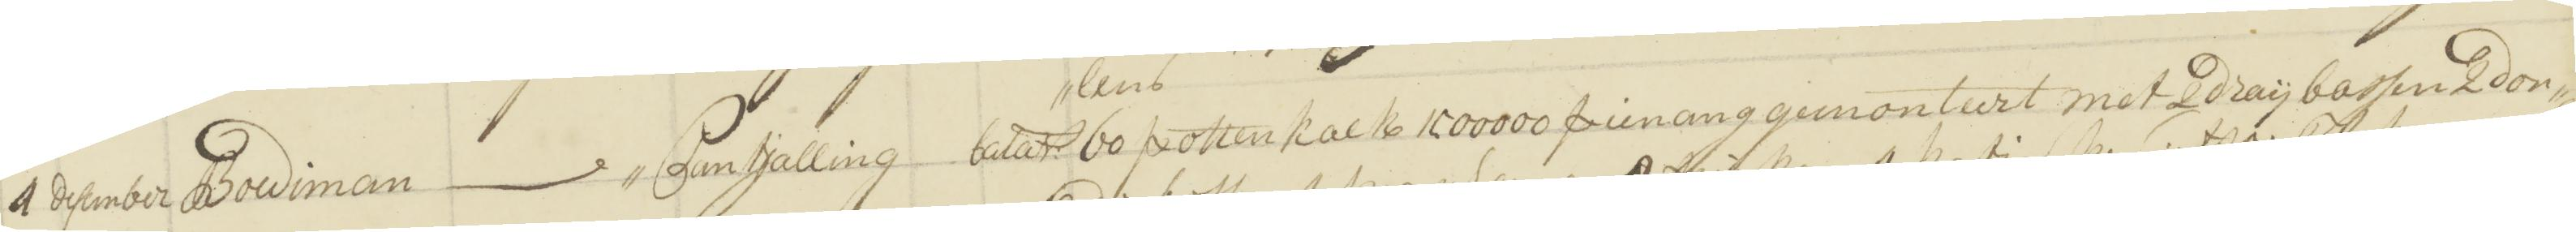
4 december Boediman _„ Pantjalling batav: 60 potten kalk 1500000 pienang gemonteert met 2 draij bossen 2 don„
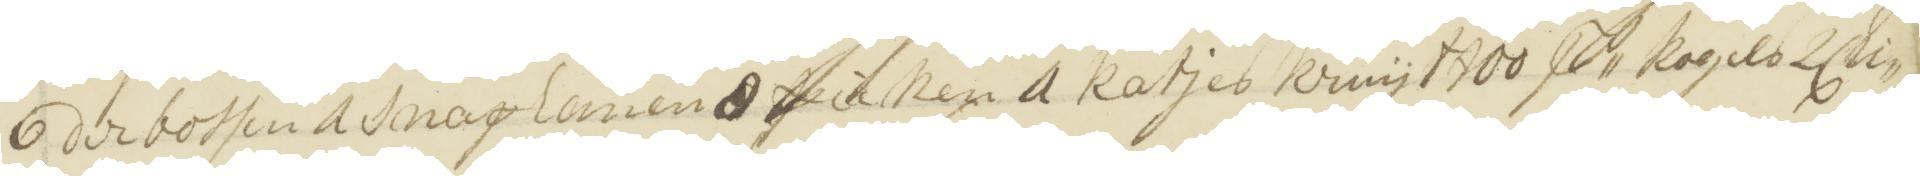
der bossen 4 snaphanen 8 pieken 4 katjes kruijt 800 p„s kogels 2 Chi„
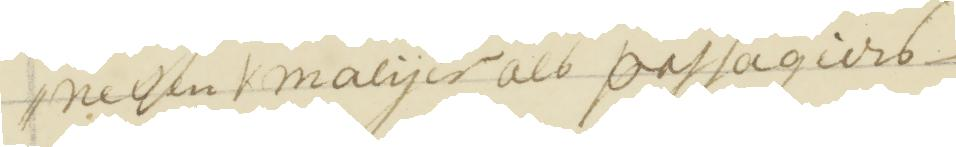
„nesen 1 malyer als passagiers
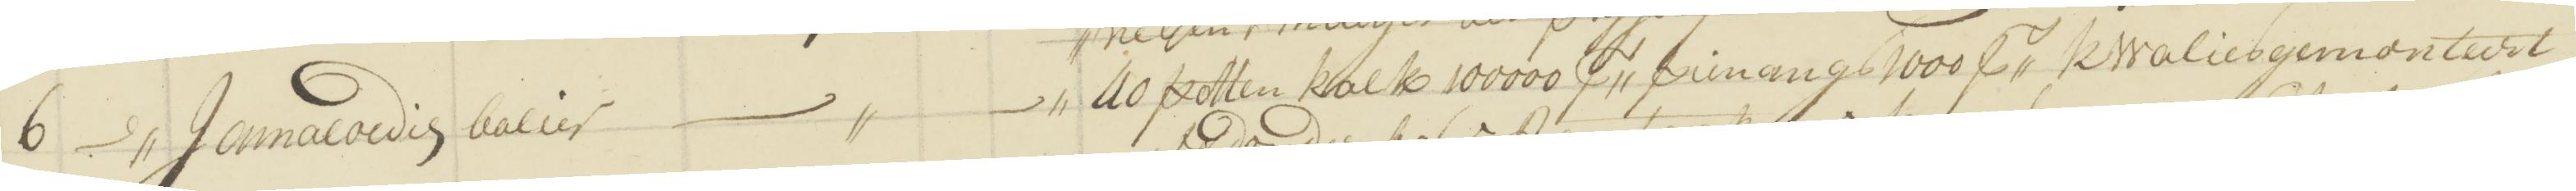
6 _„ Jamaloedien balier _„ _„ 40 potten kalk 100000 p„s pienangs 1000 p„s kwalies gemonteert
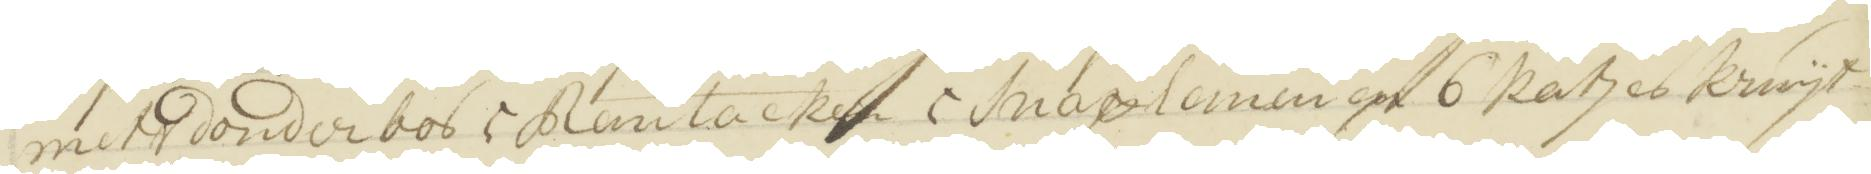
met 1 donderbos 5 Rantaeken 5 snaphanen en 6 katjes kruijt
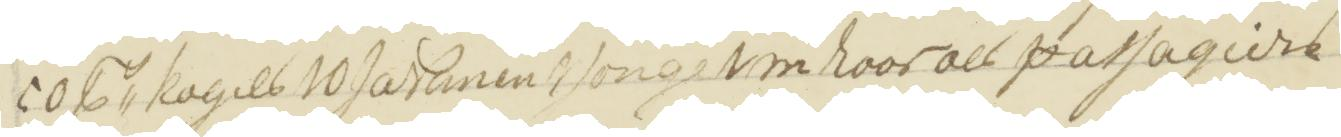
50 p„s kogels 10 Javanen 1 jongs 1 mhoor als passagiers
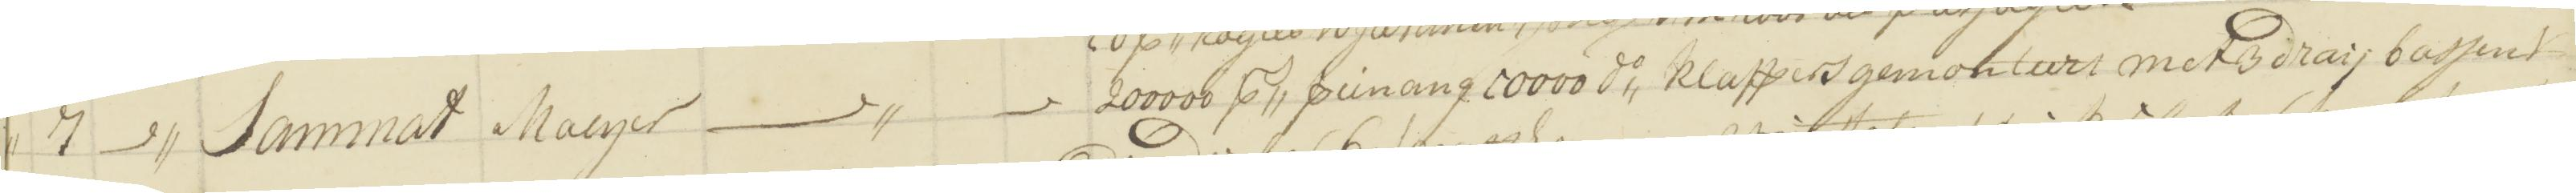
„ 7 _„ Sammat Malyer _„ _„ _ 200000 p„s pienang 50000 d„o klappers gemonteert met 3 draij bassen 1
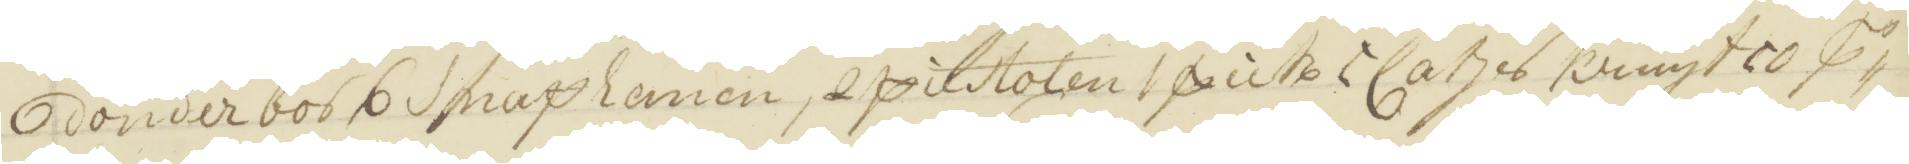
donderbos 6 snaphanen, 2 piestolen 1 piek 5 Catjes kruyt 50 p„s
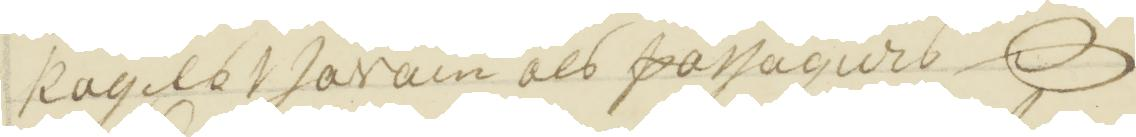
kogels 1 Javaen als passagiers
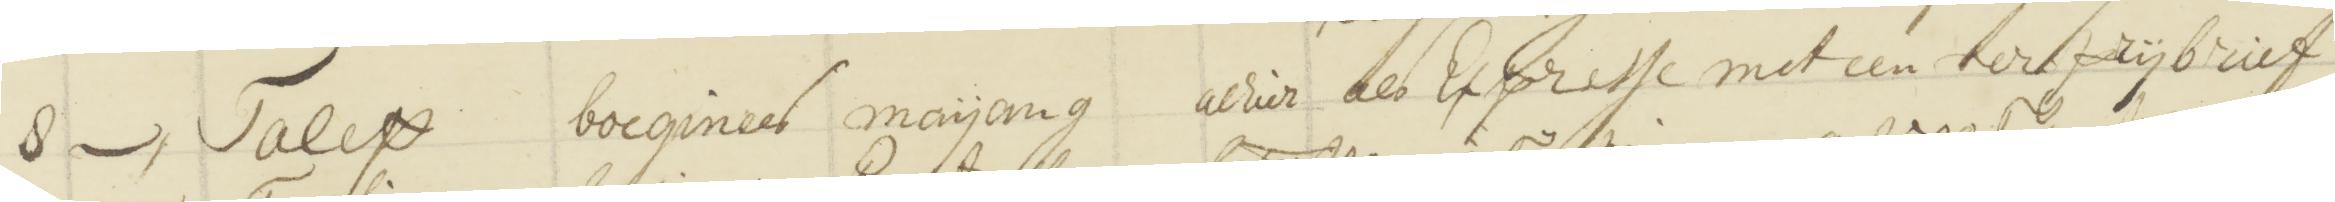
8 _„ Talep boeginees maijang alhier als Expresse met een verprijbrief
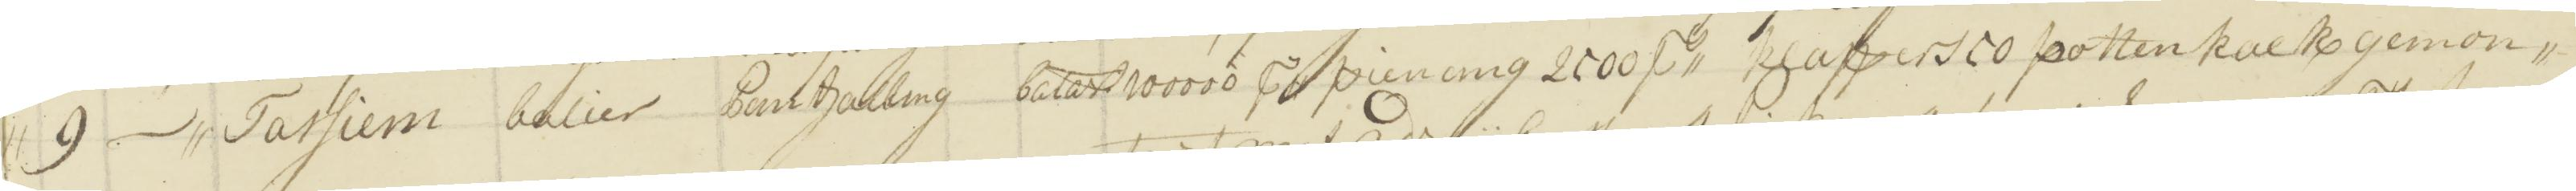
„ 9 ._„ Tassiem balier Pantjalling batav: 100000 p„s pienang 2500 p„s klappers 50 potten kalk gemon„
